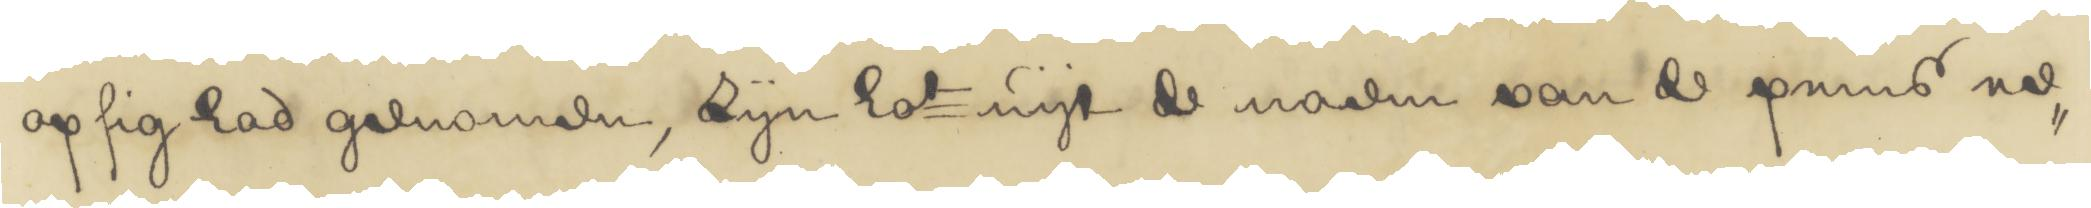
op sig had genomen, zijn ho=t uijt de naem van de prins re„
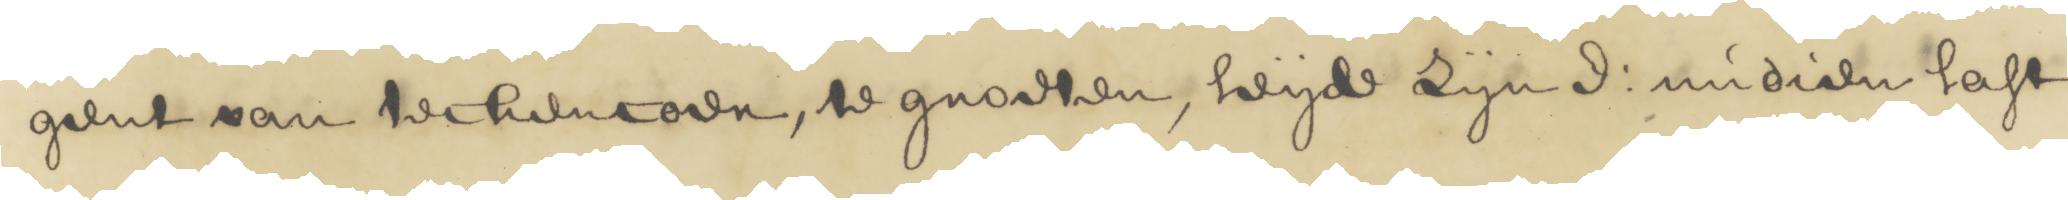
gent van teckencoer, te groeten, leijde zijn E: nu dien last
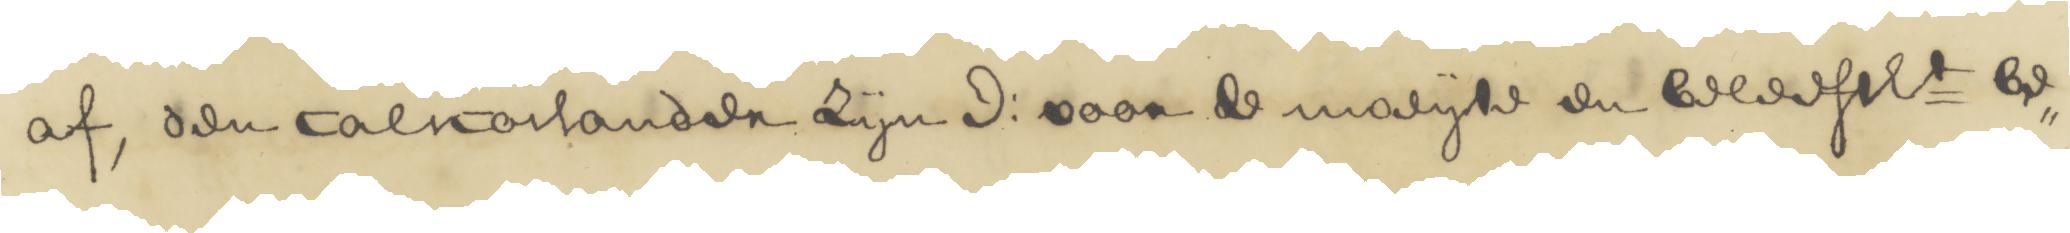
af, den calicoilander zijn E: voor de moeijte en beleefth=t be„
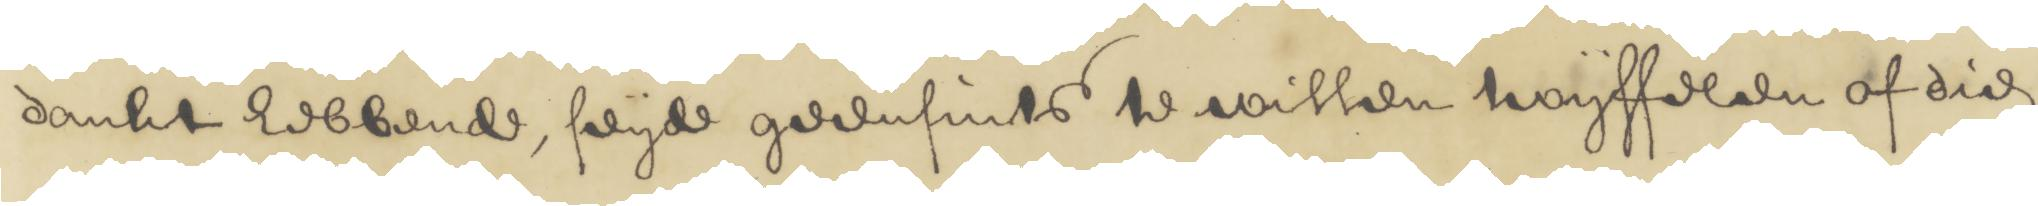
dankt hebbende, seijde geensints te willen twijffelen of dien
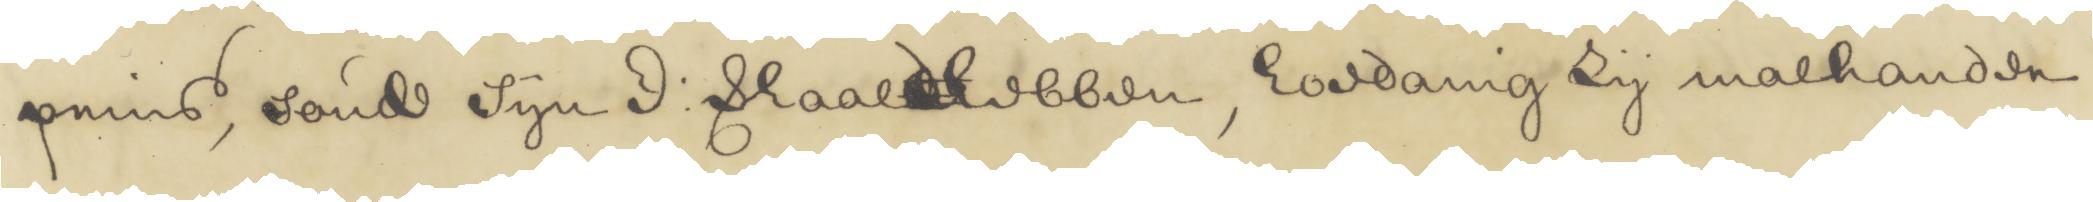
prins, soude sijn E: verhaaldhebben, hoedanig zij malkander
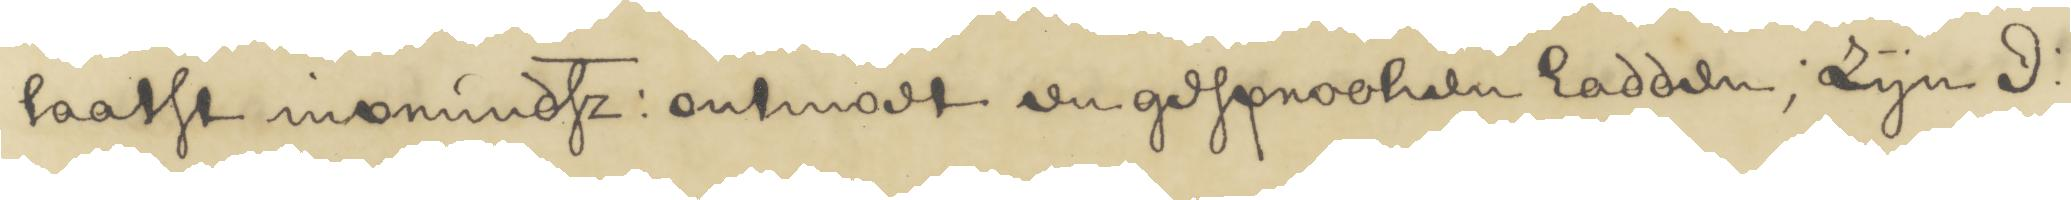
laatst invrundsz: ontmoet en gesprooken hadden; zijn E
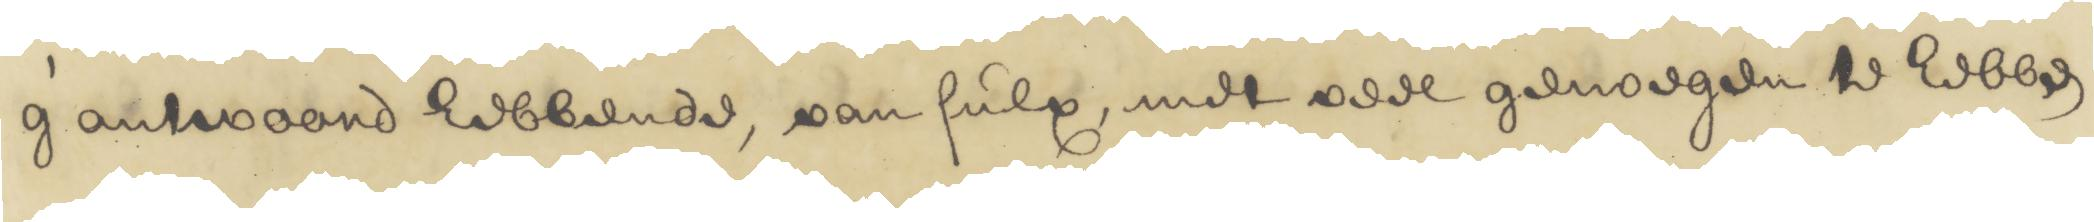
g’antwoord hebbende, van sulx, met veel genoegen te hebben
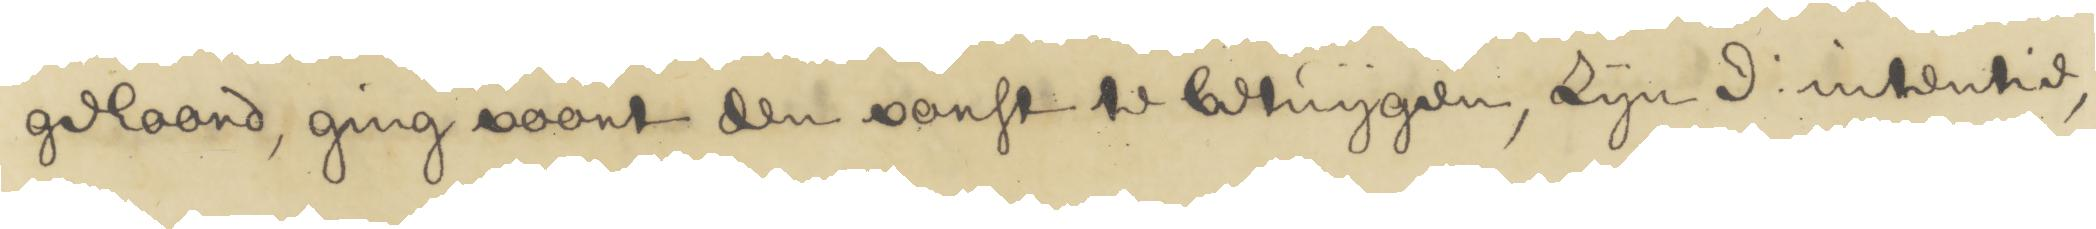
gehoord, ging voort den vorst te betuijgen, zijn E: intentie
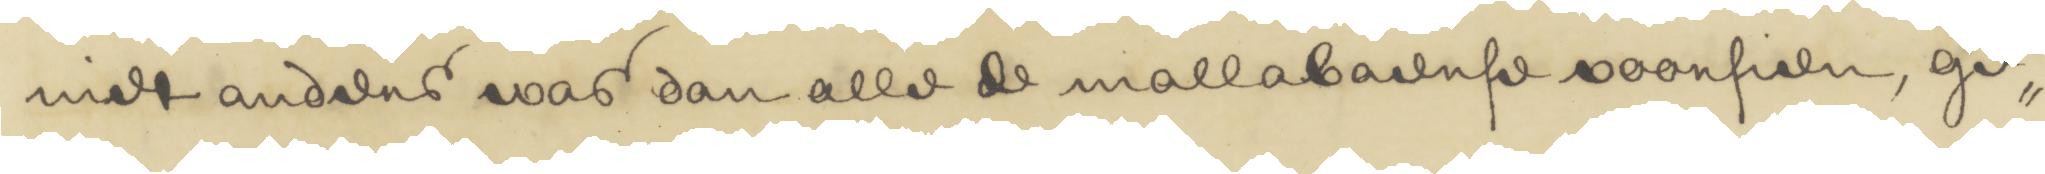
niet anders was dan alle de mallabaerse voorsien, ge„
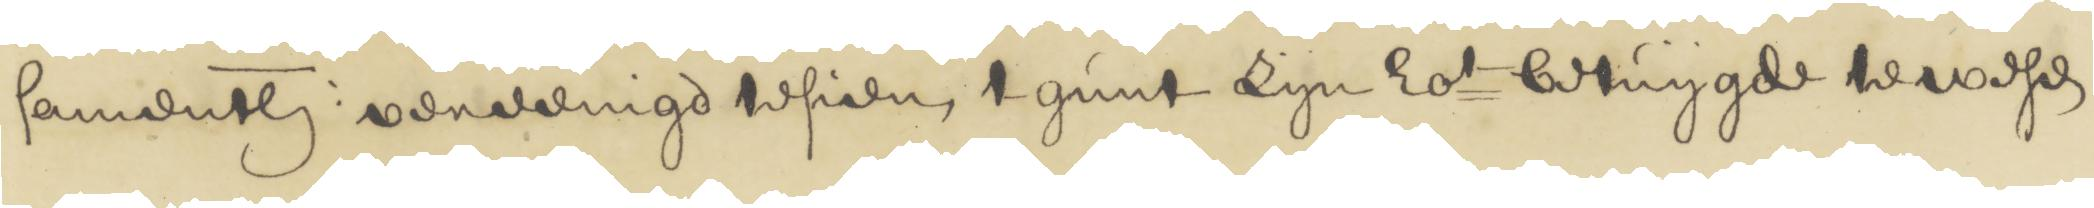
samentlijk vereenigd tesien, 't gunt zijn ho=t betuijgde te wesen
